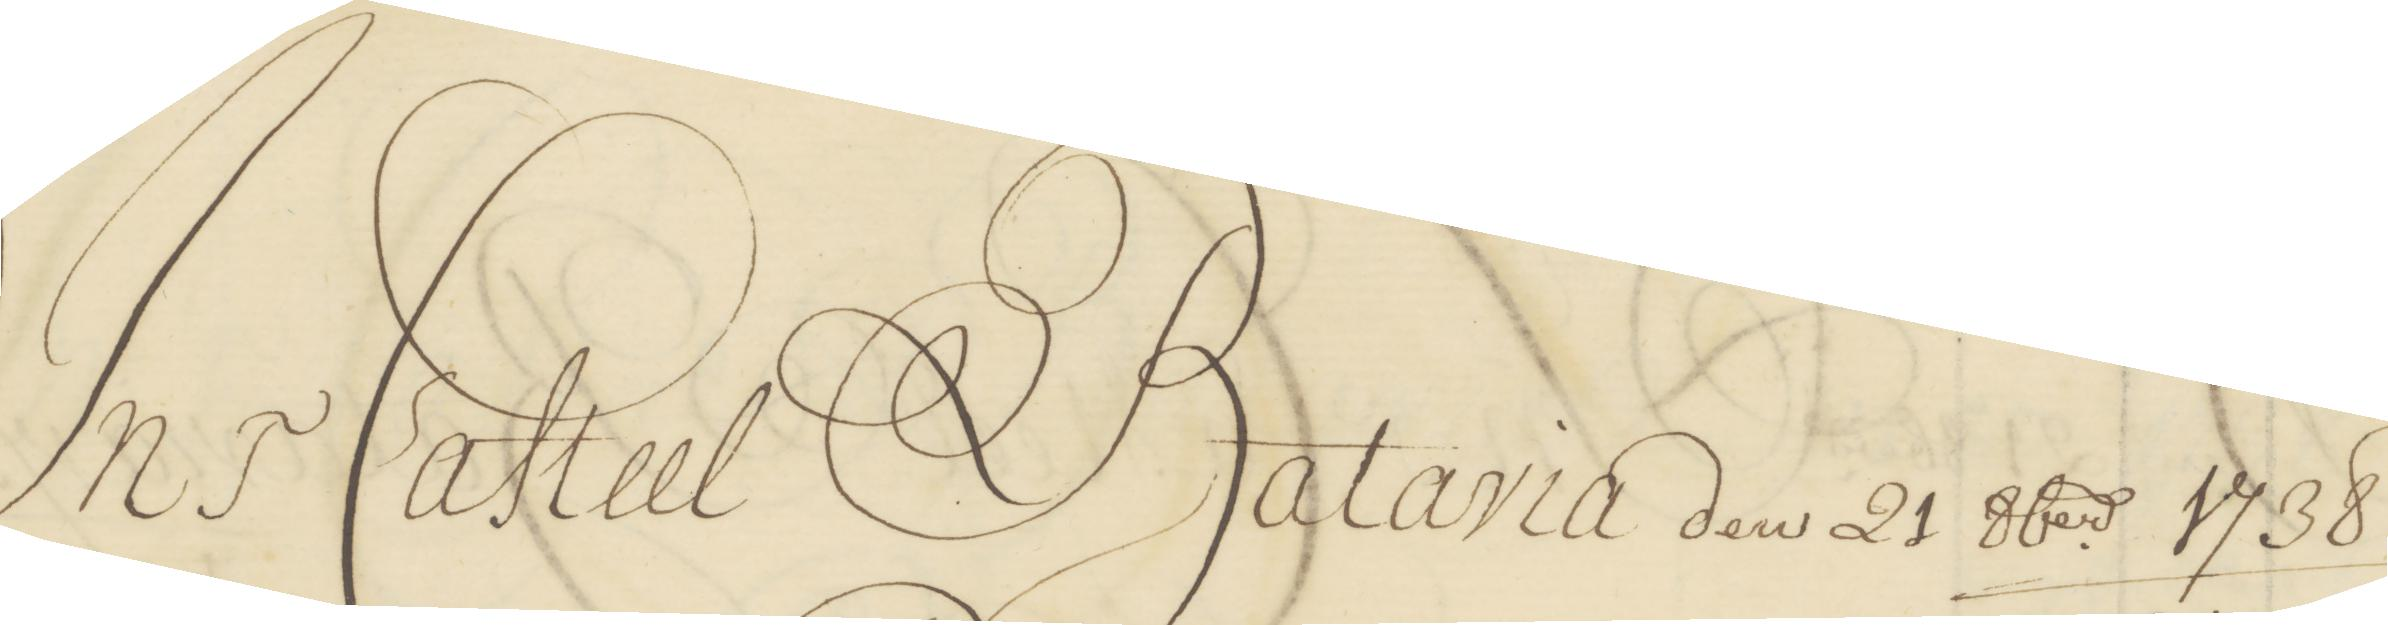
In t Casteel Batavia den 21 8b.er 1738
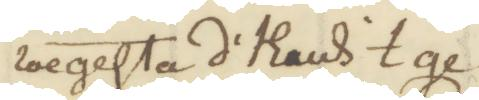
toegesta d’ thans ’t ge
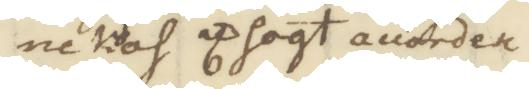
ne kas versogt accorder
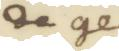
de ge
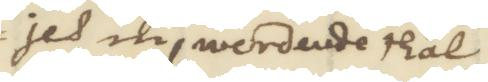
=jes in, wordende thal
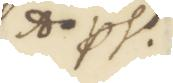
Ao ps.o
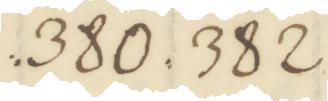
380:382
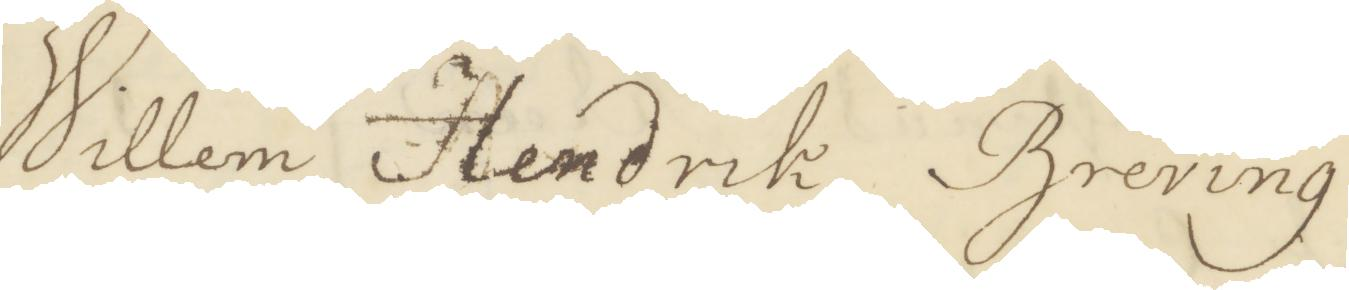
Willem Hendrik Breving
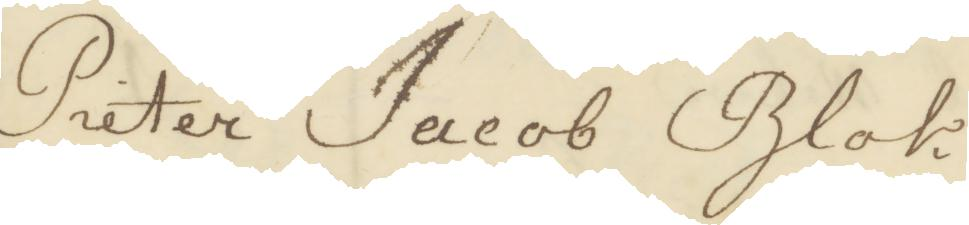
Pieter Jacob Blok
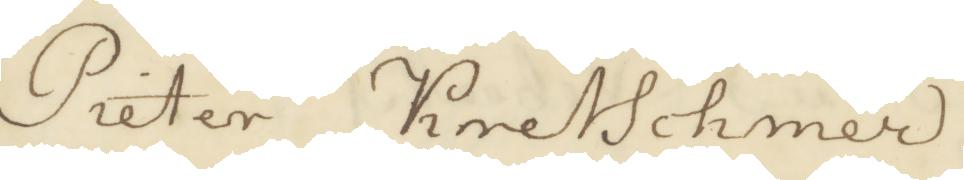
Pieter Kretschmer
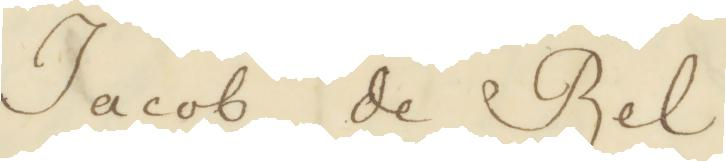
Jacob de Bel
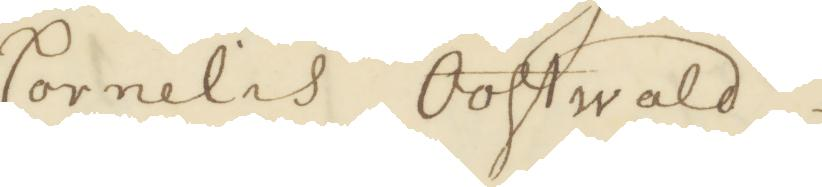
Cornelis Oostwald
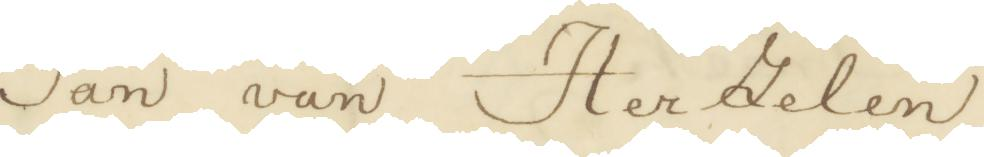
Jan van Herzelen
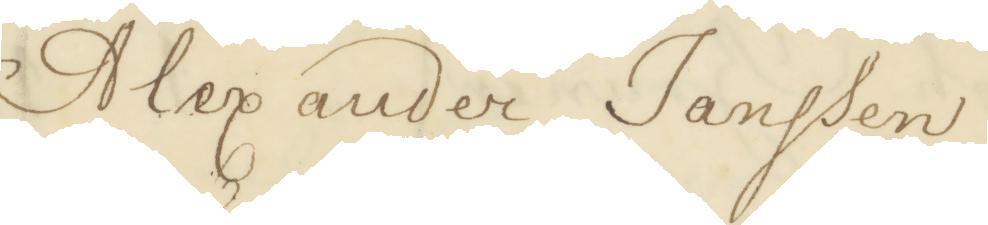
Alexander Janssen
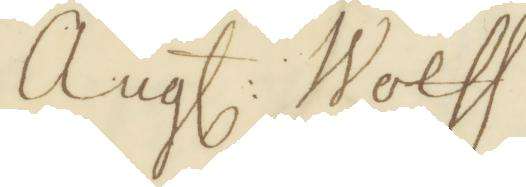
Augt: Wollf
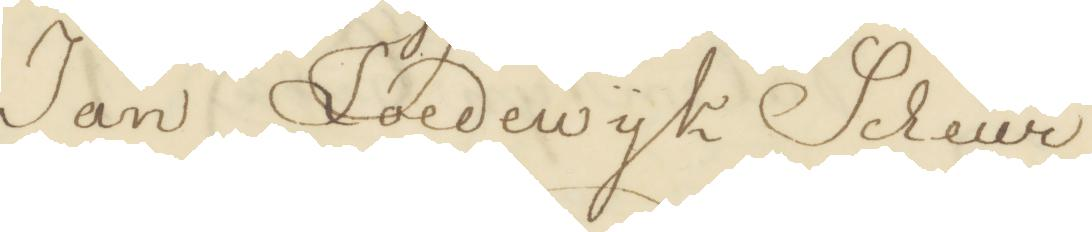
Jan Loedewijk Scheur
